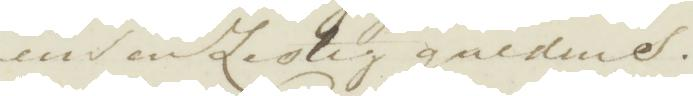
een en Zestig guldens.
